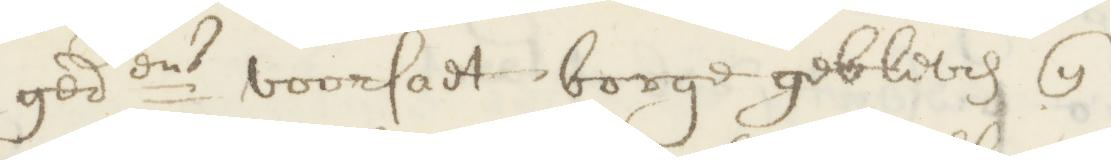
ged=ens voorsaet borge gebleven ende
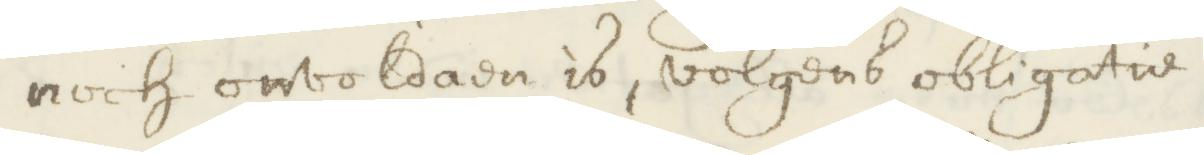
noch onvoldaen is, volgens obligatie
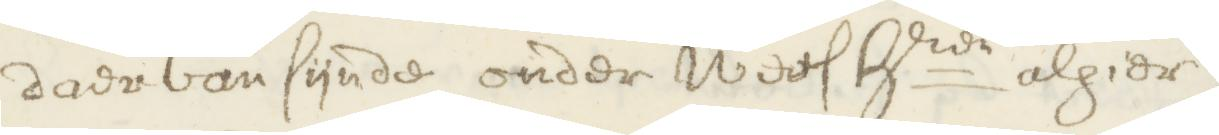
daer van sijnde onder Weesh=ren alhier
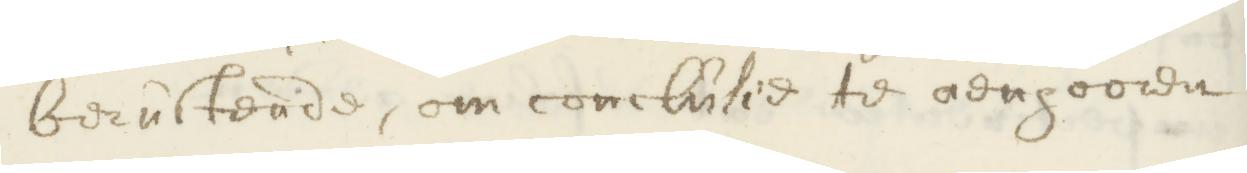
berustende, om conclusie te aenhooren
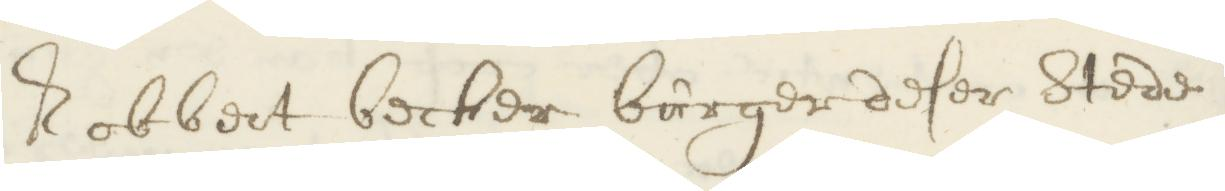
Robbert becker burger deser stede
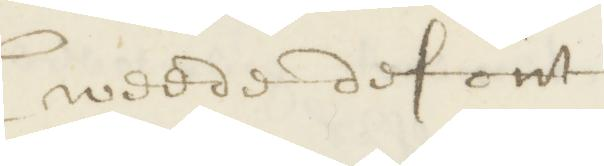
Tweede defout
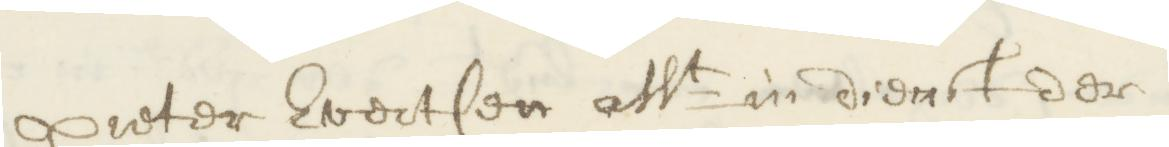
pieter Evertsen ass=t in dienst der
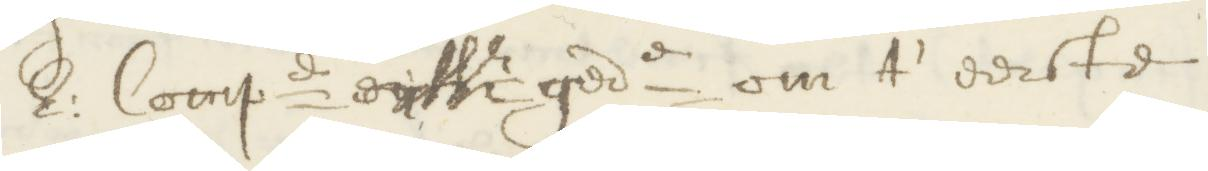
E: Comp=e eijss=r ged=e om t' eerste
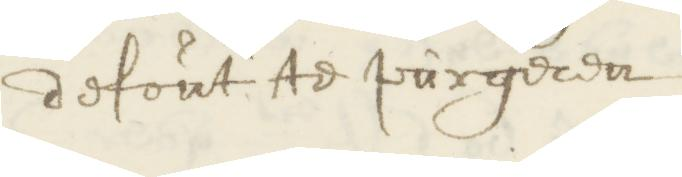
defout te paxgeren
